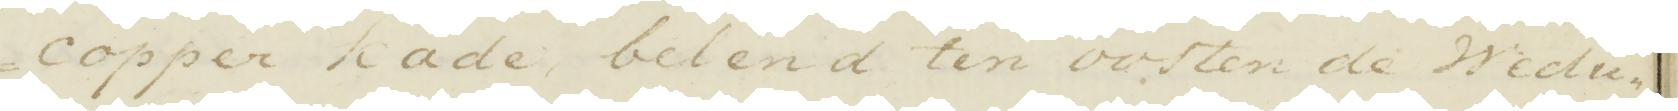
copper kade, belend ten oosten de Wedu„
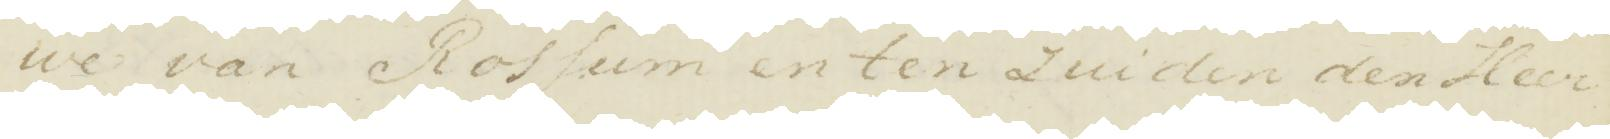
we van Rossum en ten zuiden den Heer
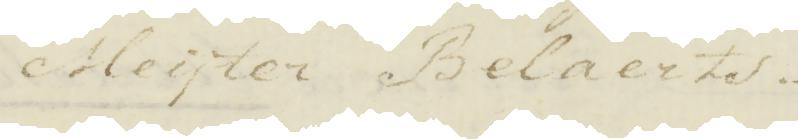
Meijter Belaerts.
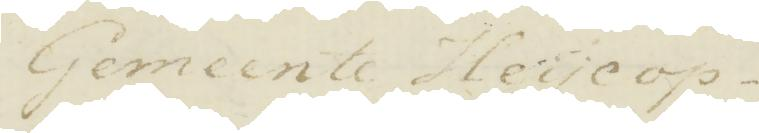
Gemeente Heijcop
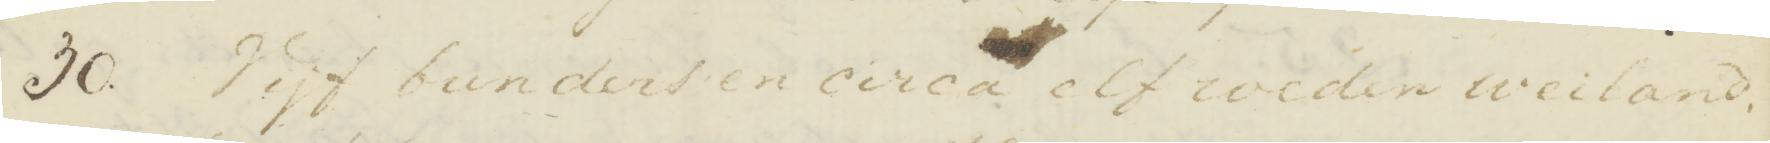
30. Vijf bunders en circa elf roeden weiland,
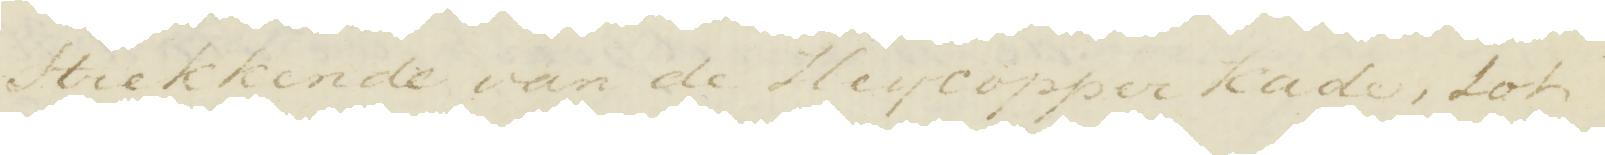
strekkende van de Heycopper kade, tot
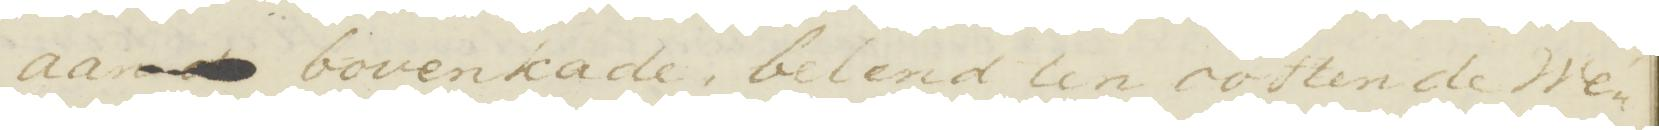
aan de bovenkade, belend ten oosten de We„
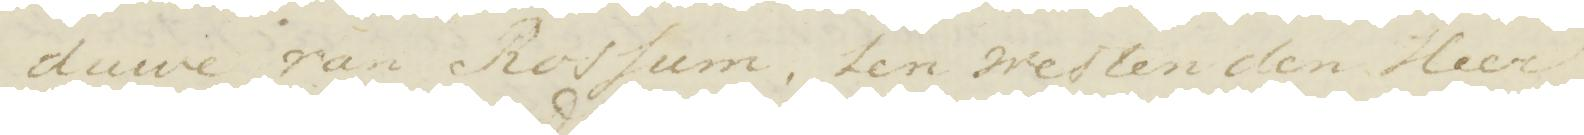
duwe van Rossum, ten westen den Heer
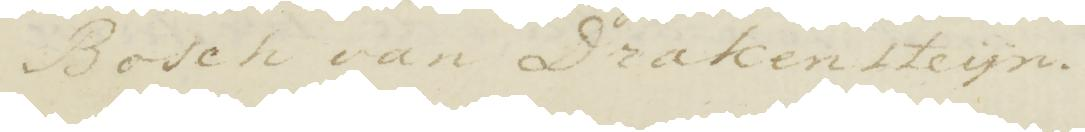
Bosch van Drakensteijn.
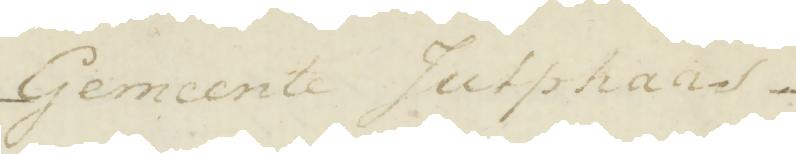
Gemeente Jutphaas.
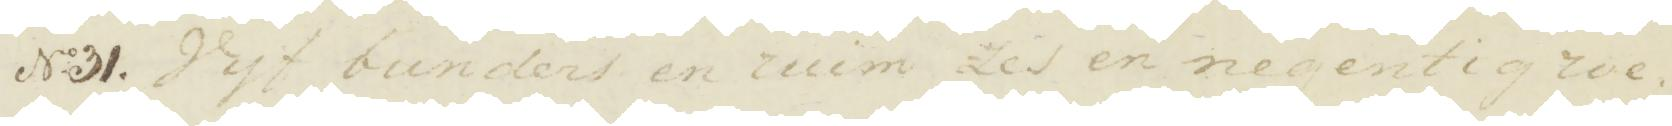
N:o 31. Vyf bunders en ruim zes en negentig roe„
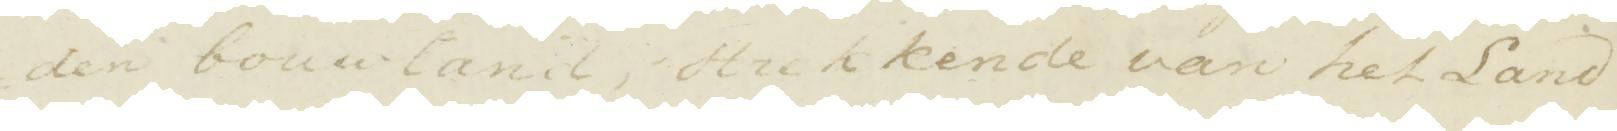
„den bouwland, strekkende van het Land
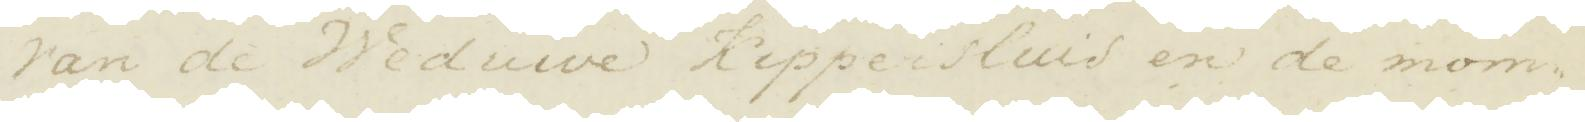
van de Weduwe Kippensluis en de mom„
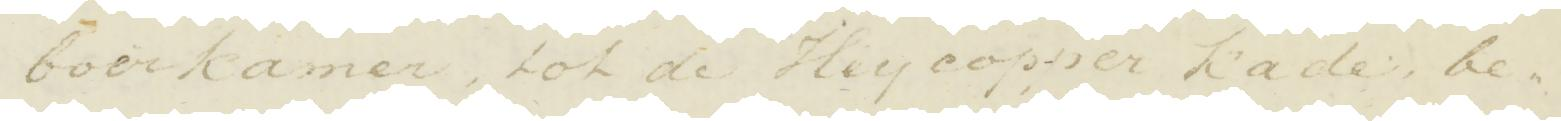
boerkamer, tot de Heycopper kade, be„
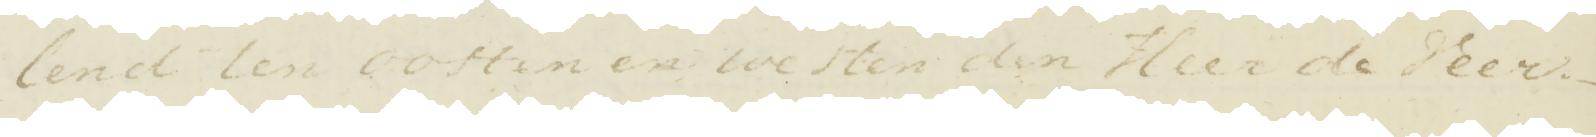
lend ten oosten en westen den Heer de Veer.
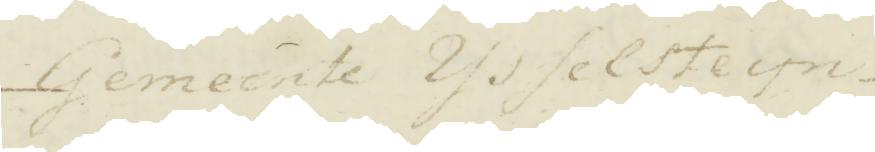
Gemeente Ysselsteyn
